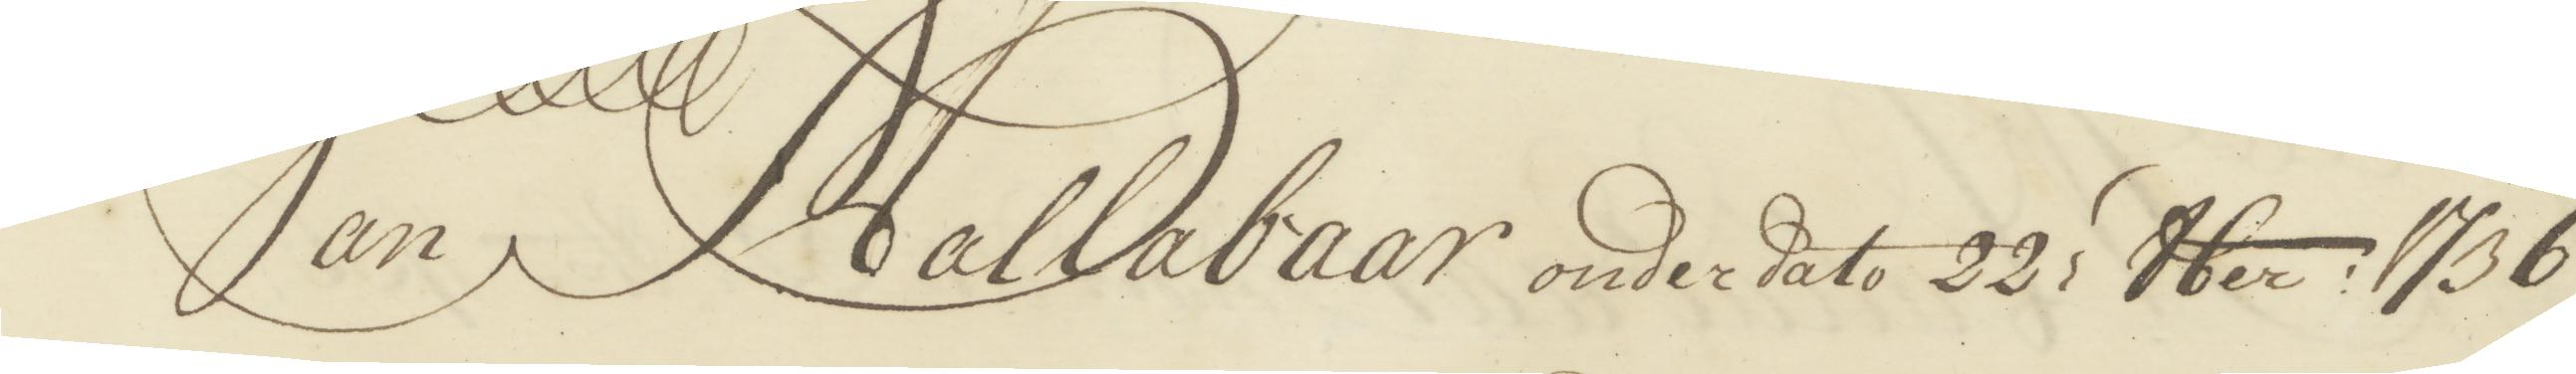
Van Mallabaar onder dato 22:' 8ber: 1736
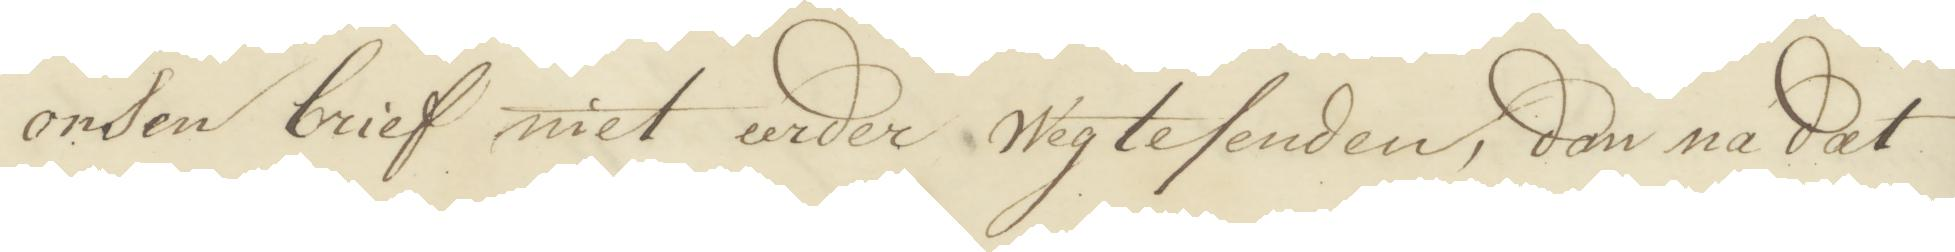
onsen brief niet eerder weg te senden, dan na dat
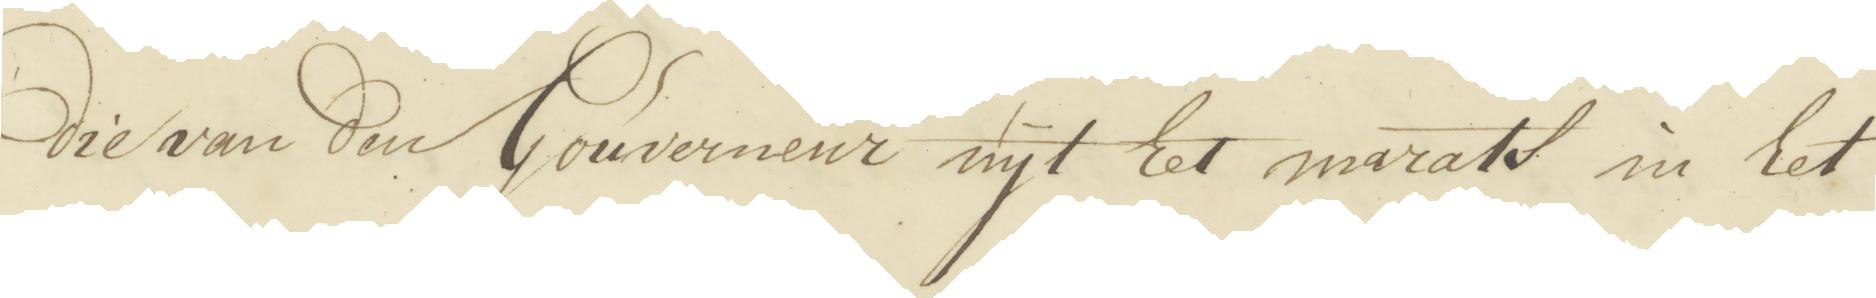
die van den Gouverneur uijt het marats in het
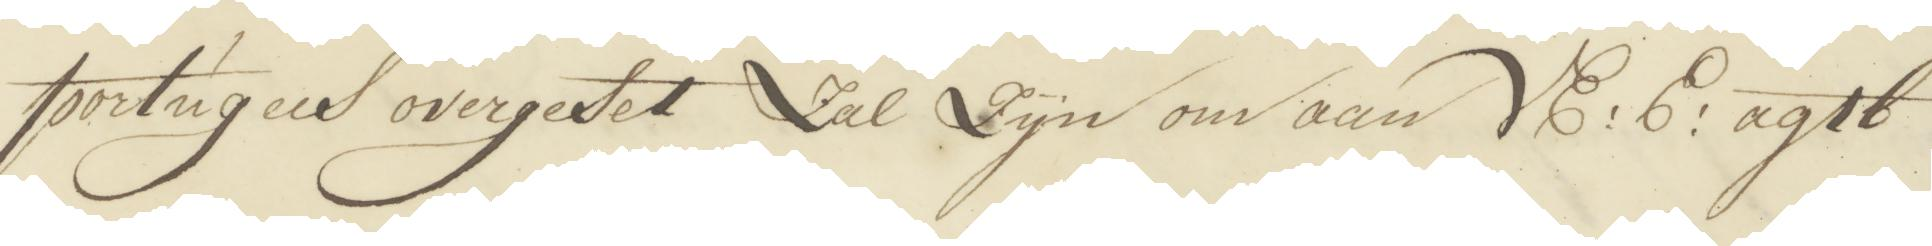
portugees overgeset zal zijn om aan VE: E: agtb
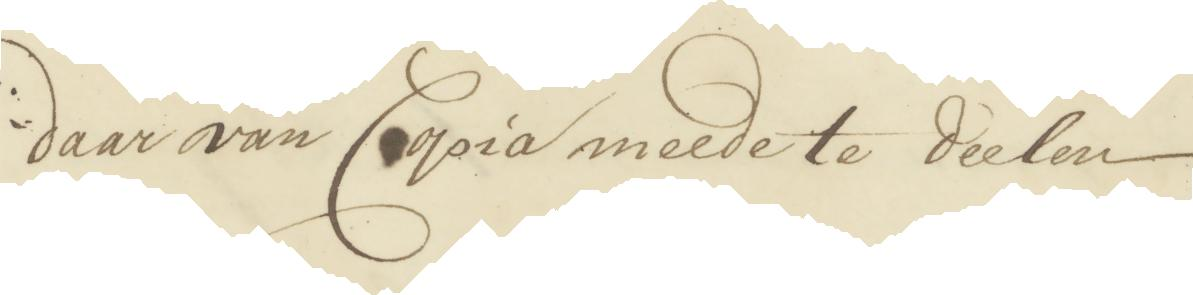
daar van Copia meede te deelen
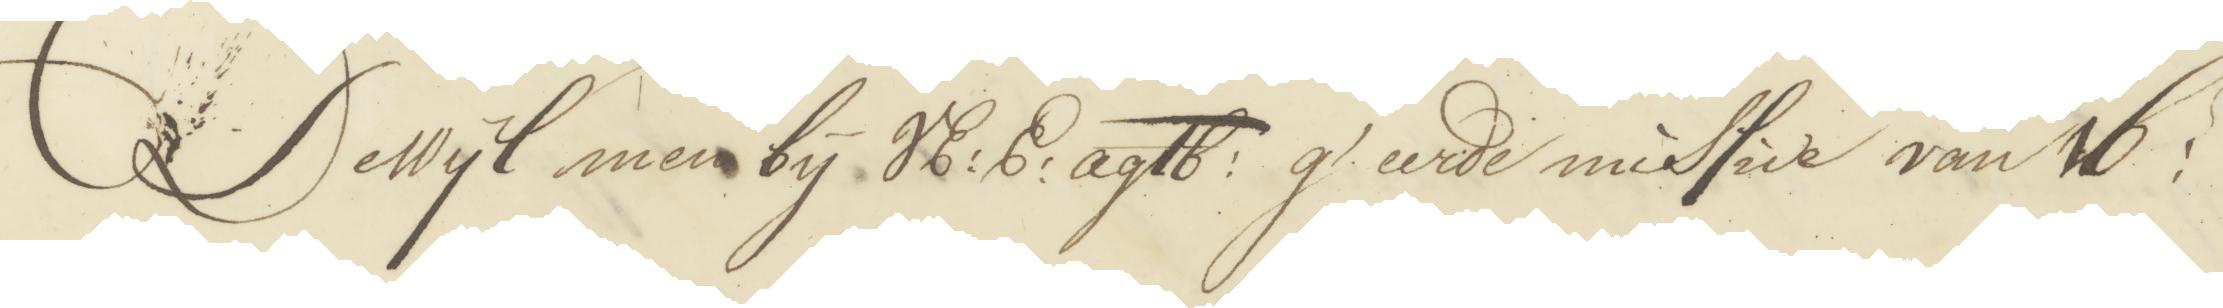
Dewijl men bij VE: E: agtb: g’eerde missive van 16:'
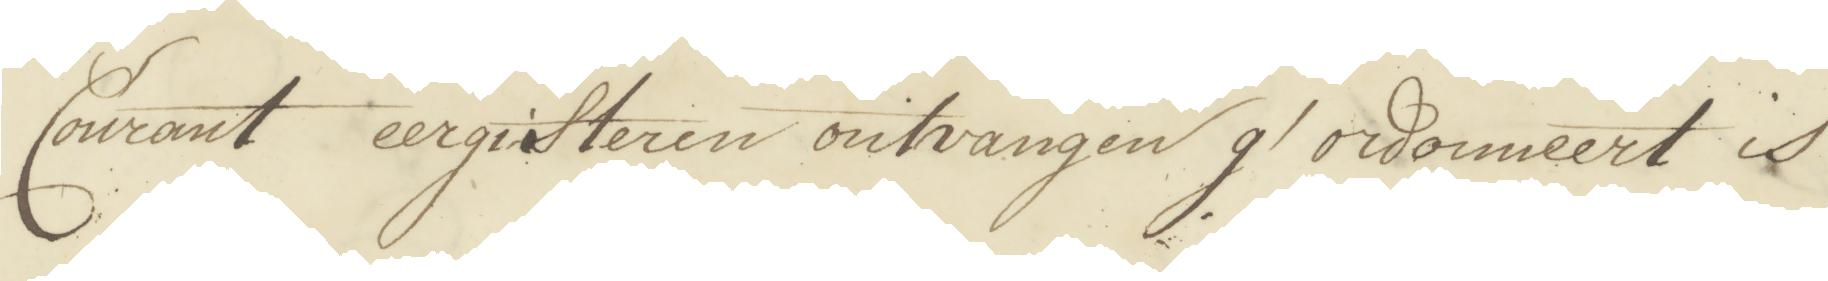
Courant eergisteren ontvangen g’ordonneert is
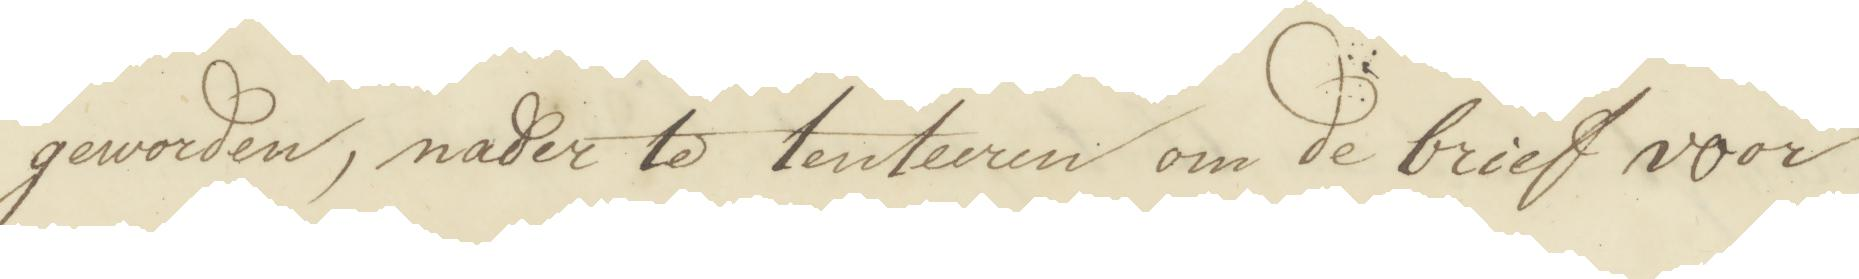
geworden, nader te tenteeren om de brief voor
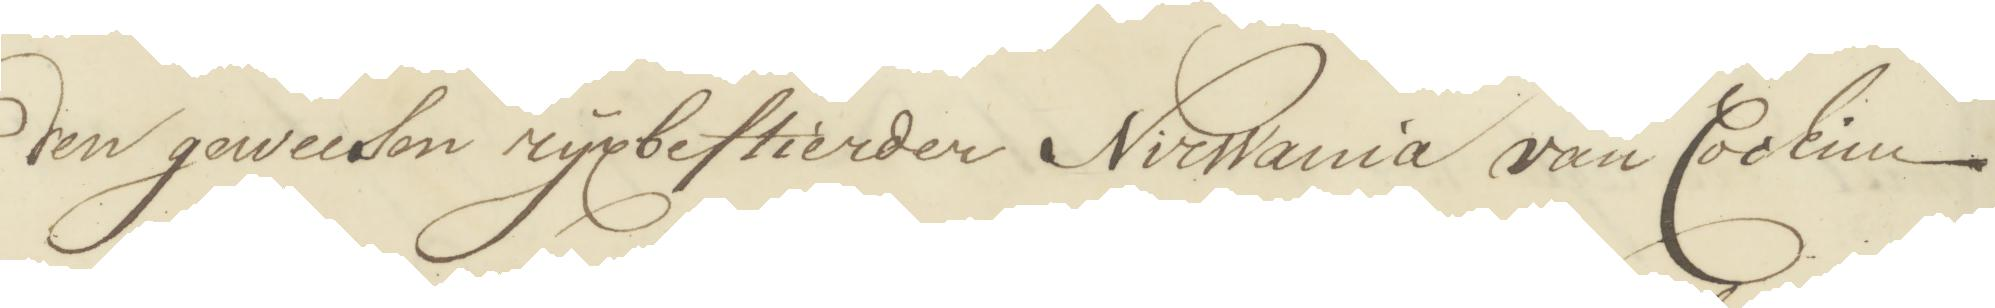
den geweesen rijxbestierder Nirwania van Cochim
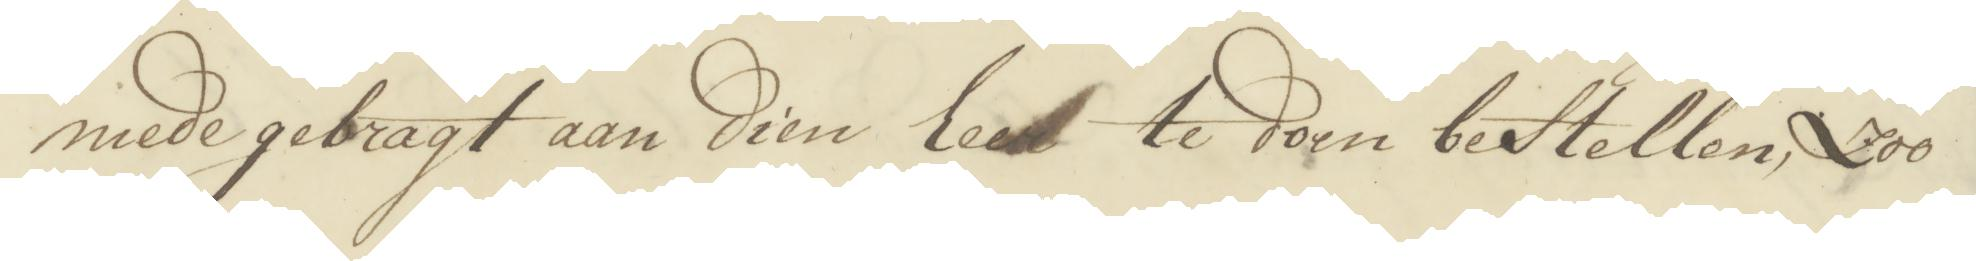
mede gebragt aan dien heer te doen bestellen, zoo
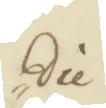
„die
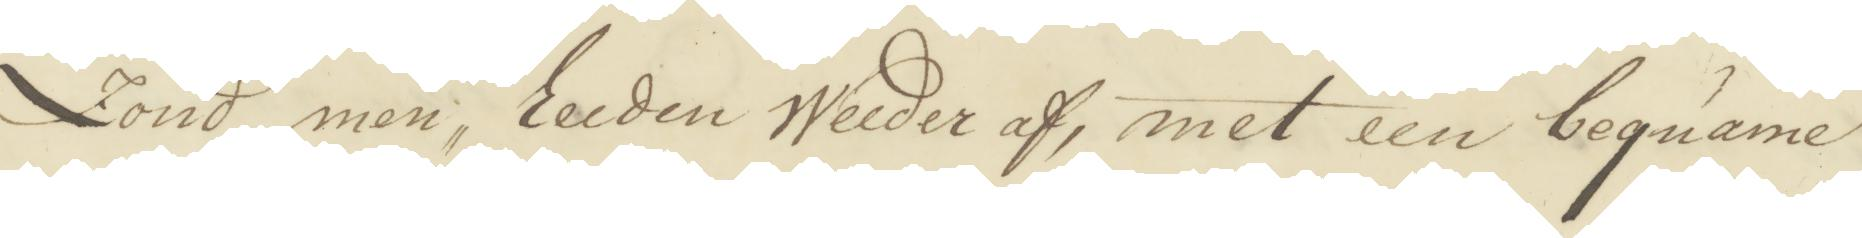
zond men„ heeden weeder af, met een bequame
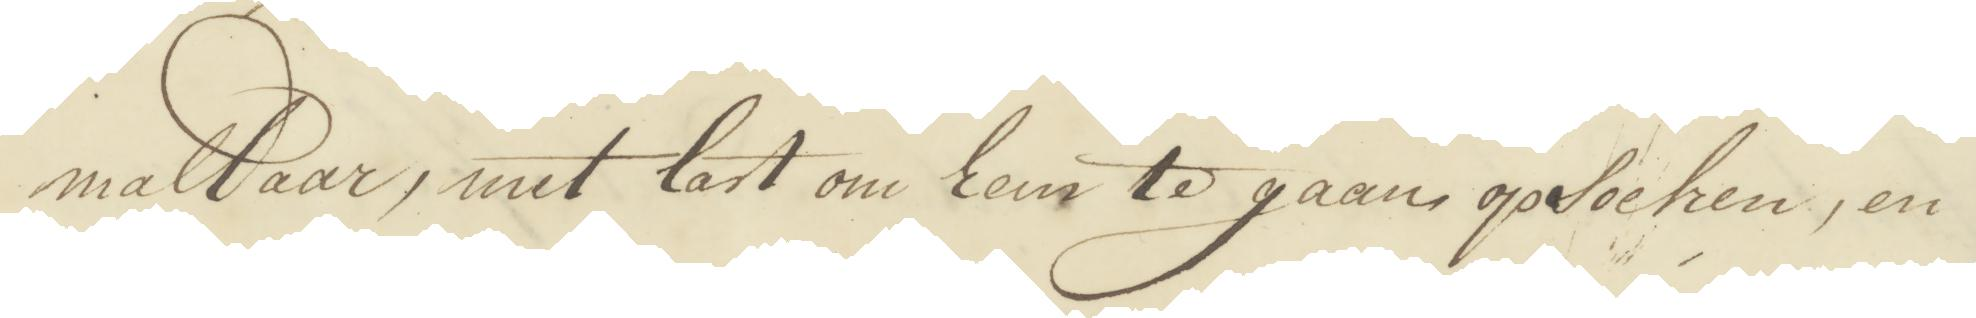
maltaar, met last om hem te gaan opsoeken, en
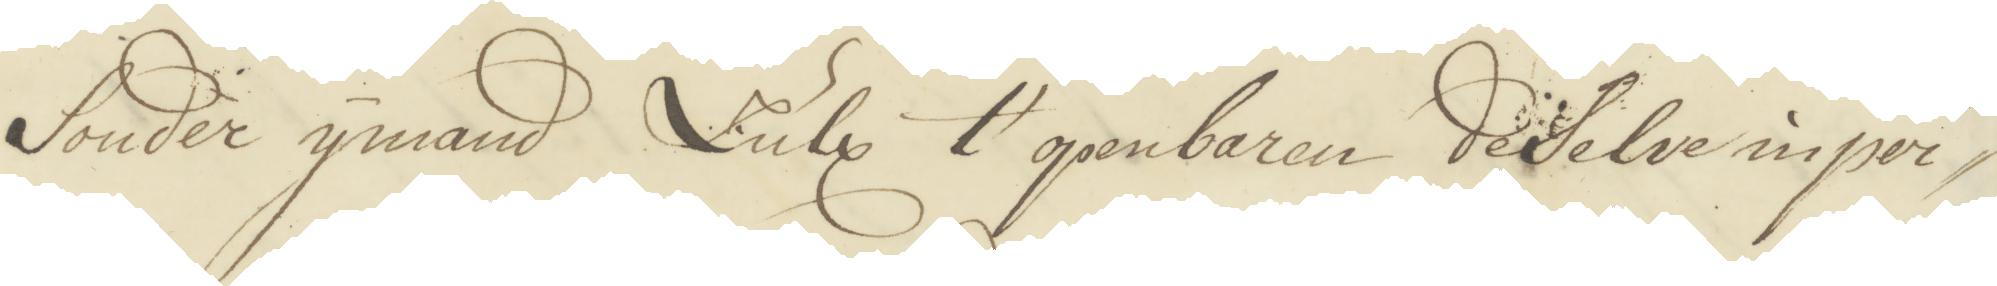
sonder ijmand zulx t' openbaren deselve in per„
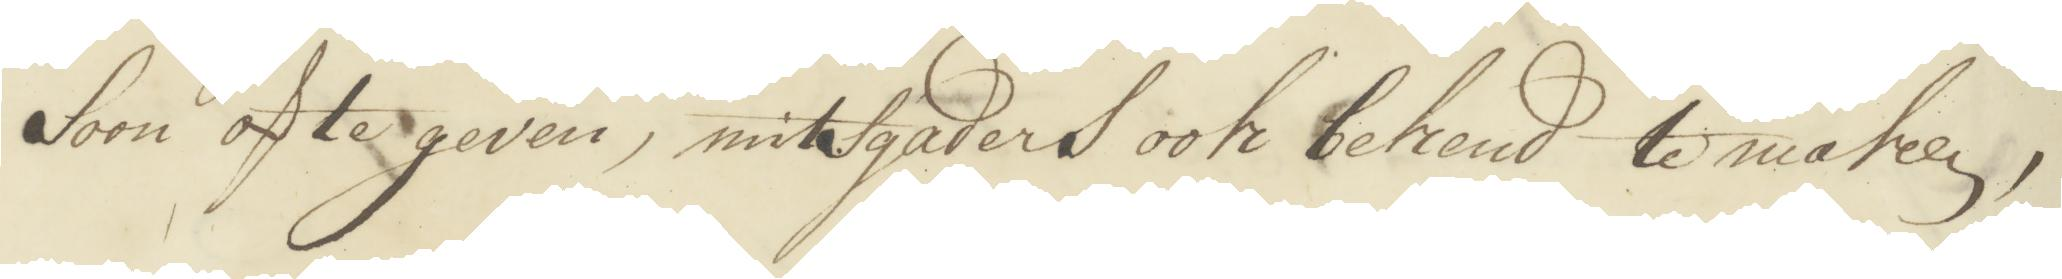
soon over te geven, mitsgaders ook bekend te maken,
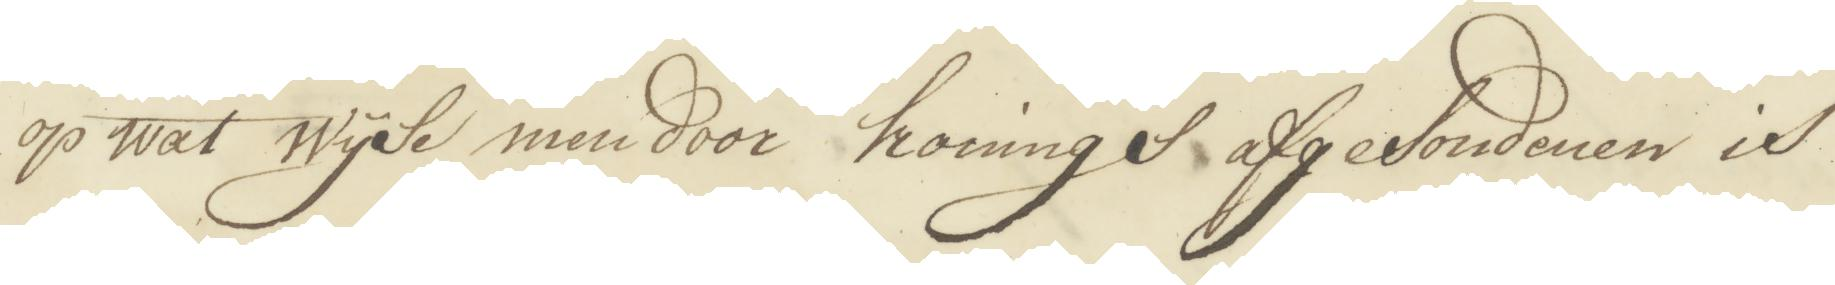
op wat wijse men door konings afgesondenen is
